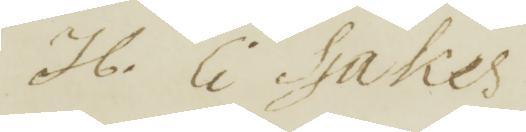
H. C Sjakes
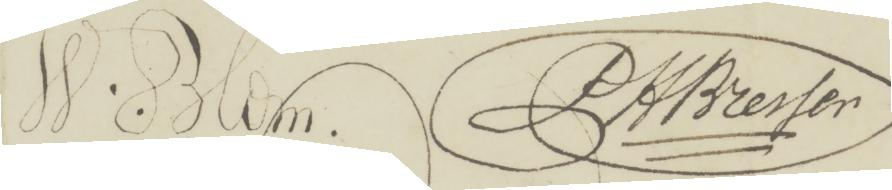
W:Blom. PHBresser
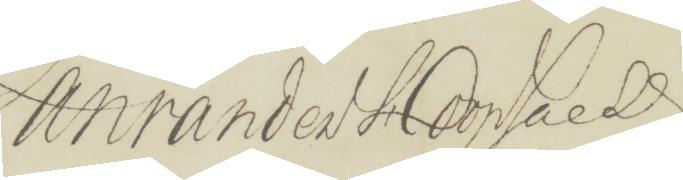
Jan van der Hoop Jacz=n
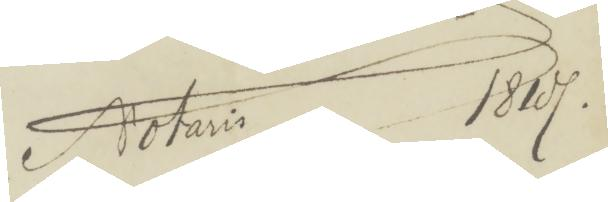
Notaris 1847.
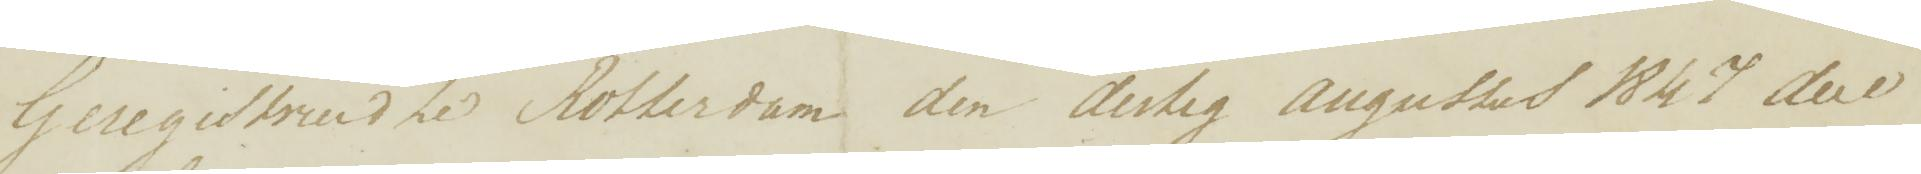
Geregistreerd te Rotterdam den dertig augustus 1847 deel
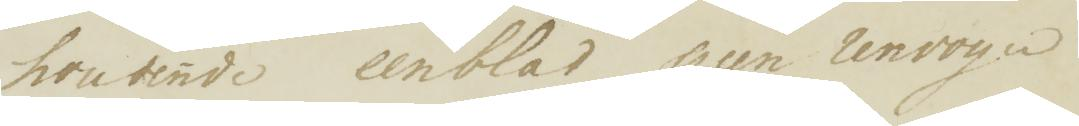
houdende een blad geen renvoyen
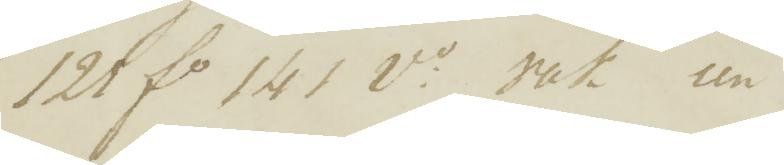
121 fo 141 v:o vak een
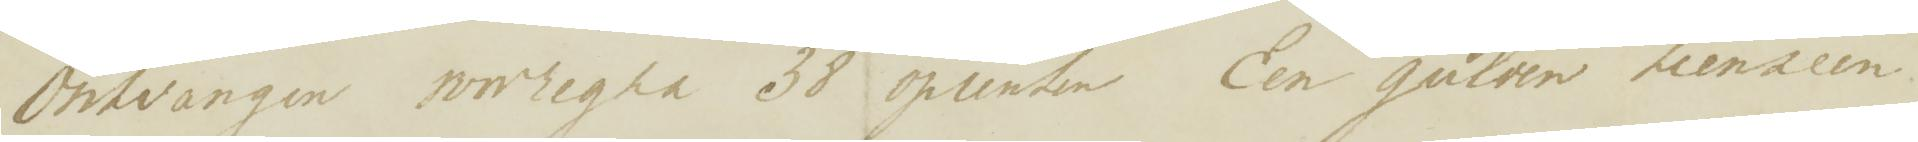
Ontvangen voorregten 38 opcenten Een gulden tieneneen
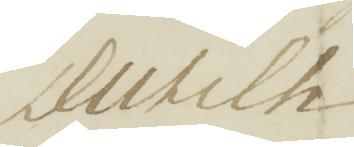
Dutilh
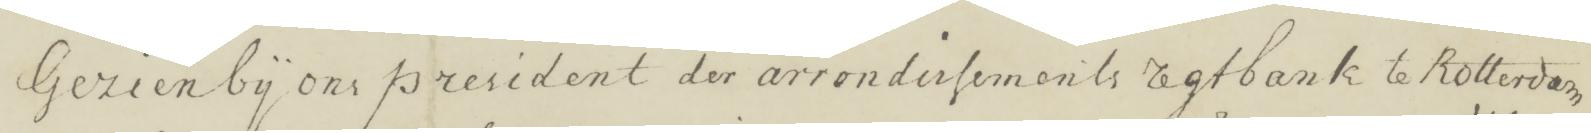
Gezien bij ons president der arrondissements regtbank te Rotterdam
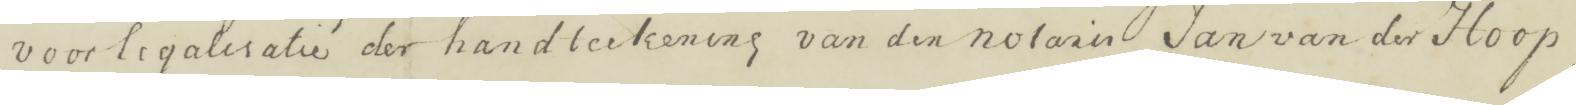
voor legalisatie der handteekening van den notaris Ian van der Hoop
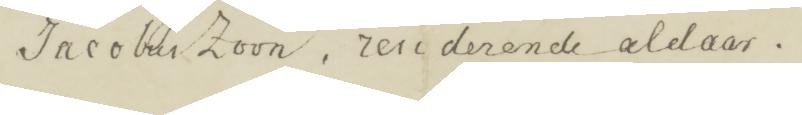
Iacobs zoon, residerende aldaar.
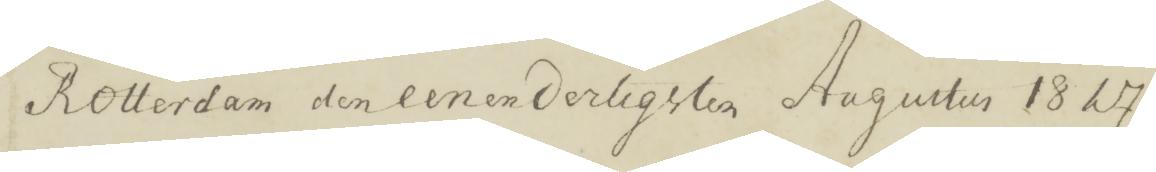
Rotterdam den eenendertigsten Augustus 1847
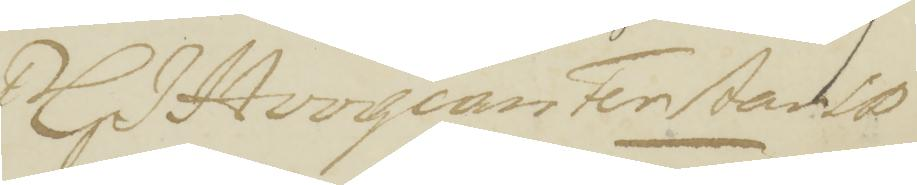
PGJ Hoogvan Ter Aar
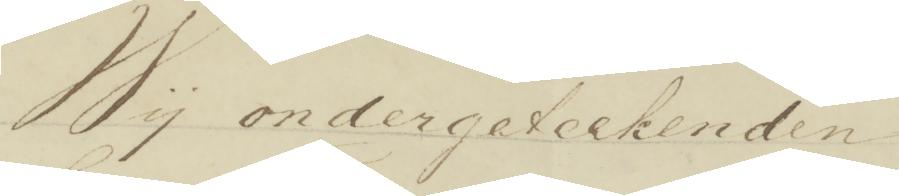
Wij ondergeteekenden
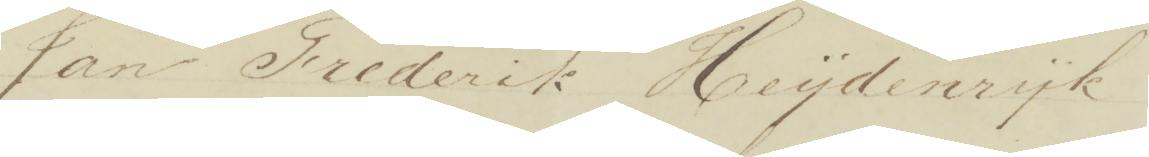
Jan Frederik Heijdenrijk
